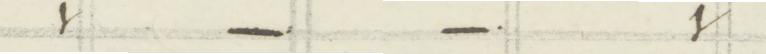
1 —. —. 1
